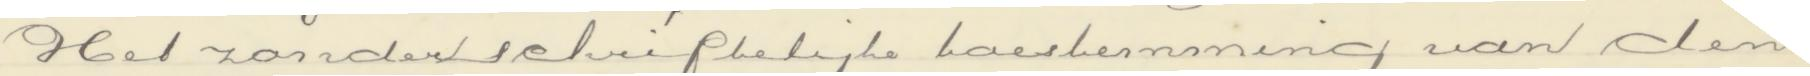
Het zonder schriftelyke toestemming van den
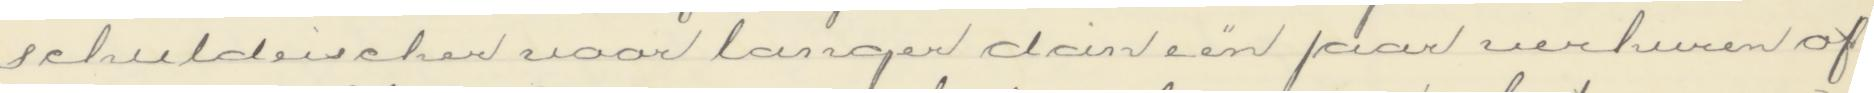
schuldeischer voor langer dan één jaar verhuren of
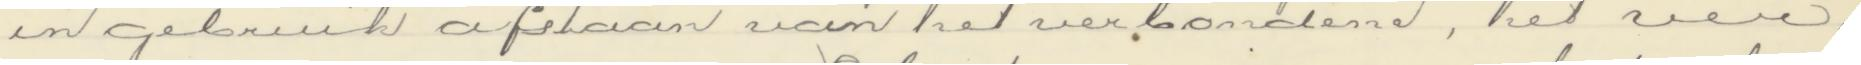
in gebruik afstaan van het verbondene, het ver
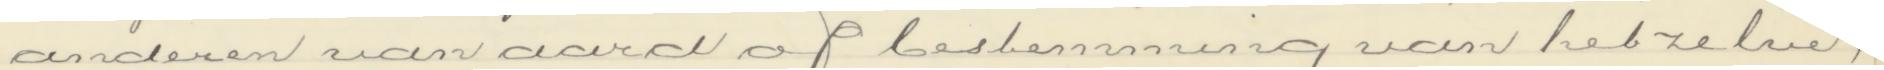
anderen van aard of bestemming van hetzelve,
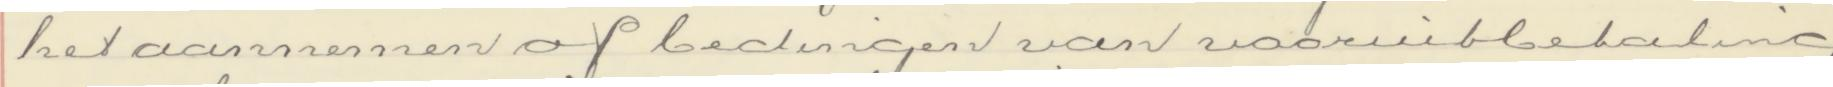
het aannemen of bedingen van vooruitbetaling
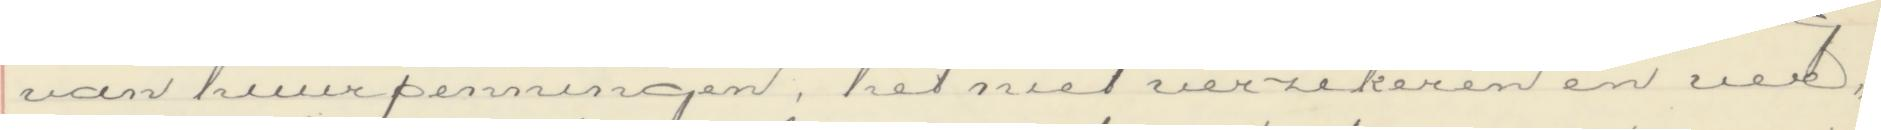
van huurpenningen, het niet verzekeren en ver„
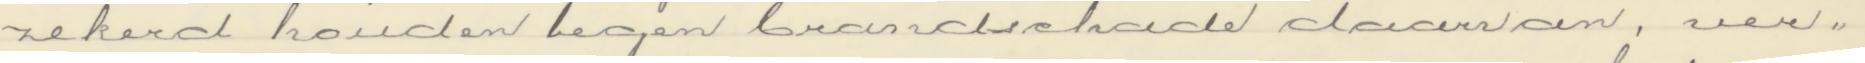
zekerd houden tegen brandschade daarvan, ver„
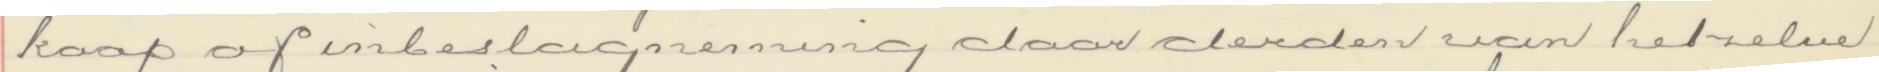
koop of inbeslagneming door derden van hetzelve
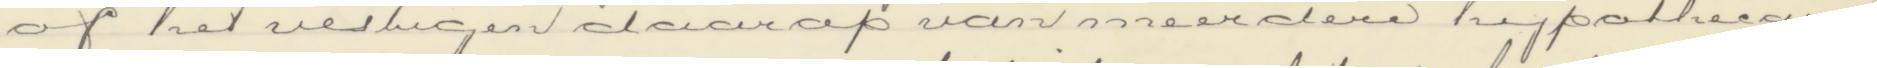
of het vestigen daarop van meerdere hypothecaire
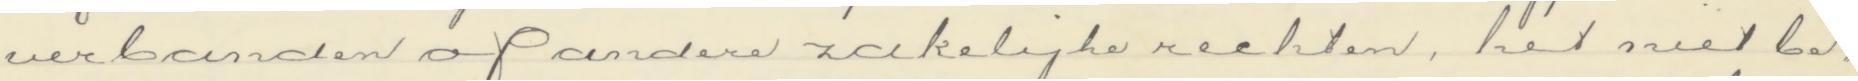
verbanden of andere zakelijke rechten, het niet be„
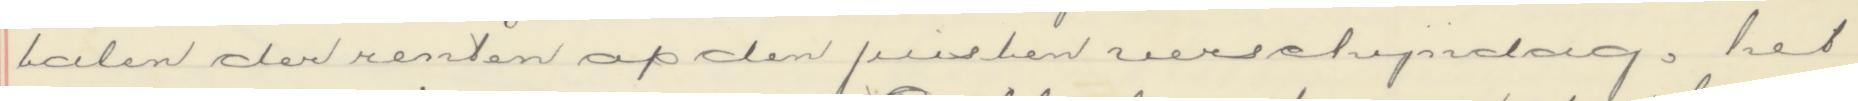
talen der renten op den juisten verschijndag, het
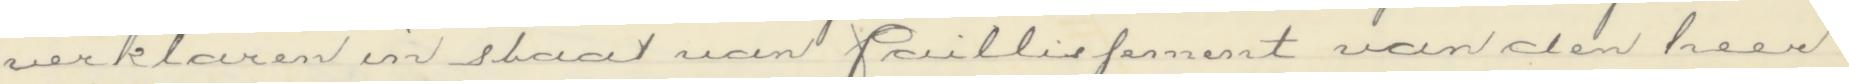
verklaren in staat van faillissement van den heer
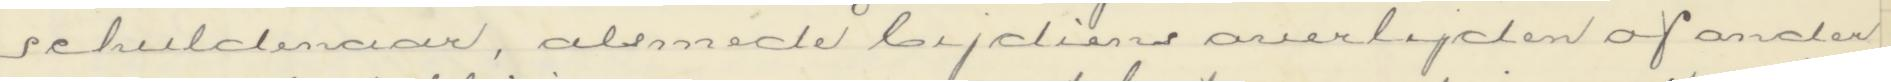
schuldenaar, alsmede bij diens overlijden of onder
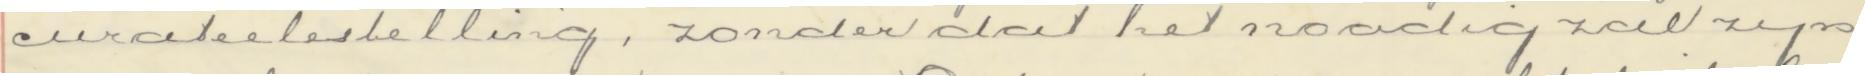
curateelestelling, zonder da he noodig zal zijn
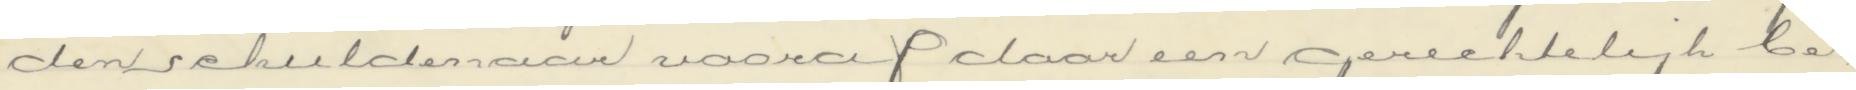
den schuldenaar vooraf door een gerechtelijk be
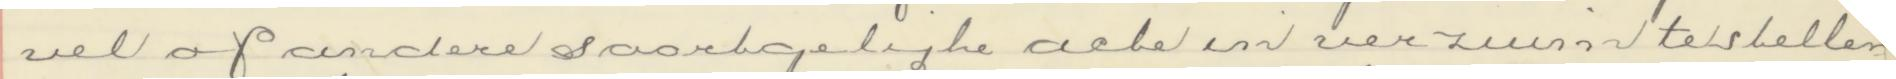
vel of andere soortgelijke acte in verzuim te stellen
